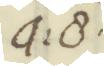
4:8
